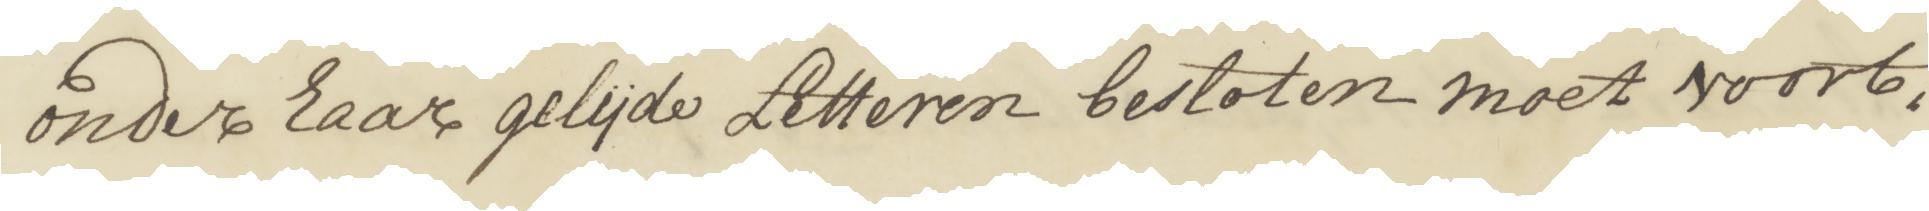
onder haar gelijde Letteren besloten moet voort„
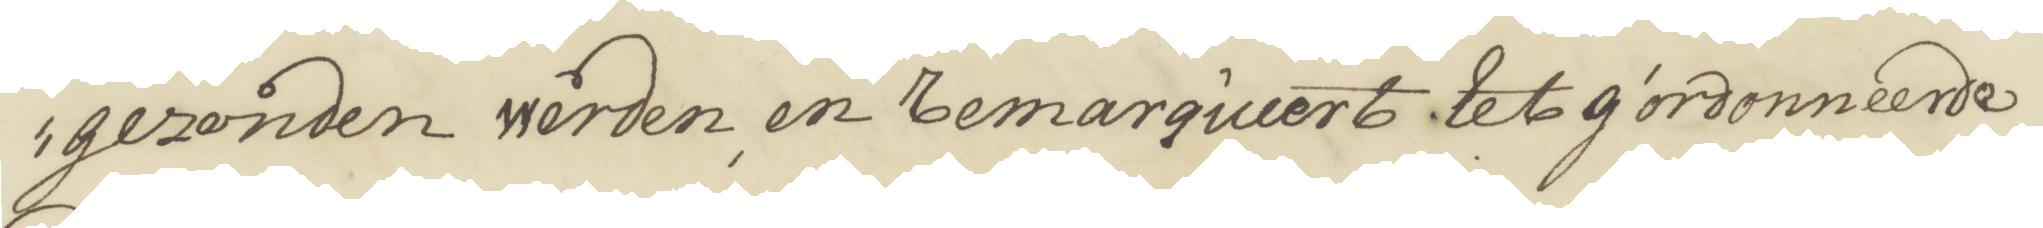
„gezonden werden, en Remarqueert het g’ordonneerde
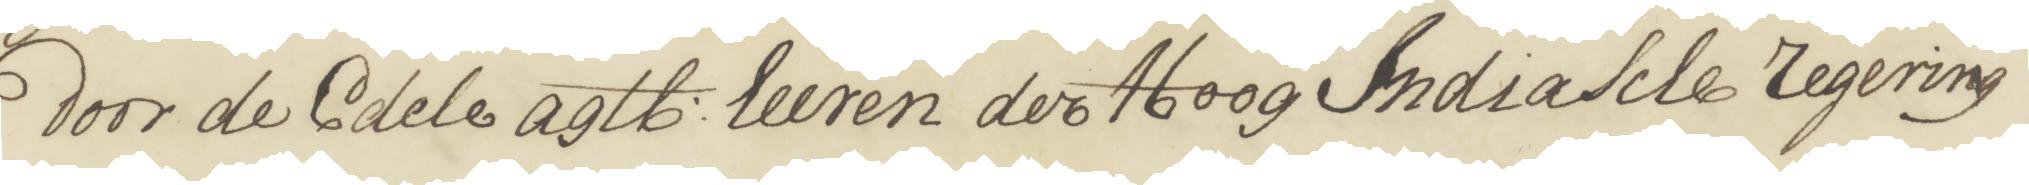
door de Edele agtb: heeren der Hoog Indiasche Regering
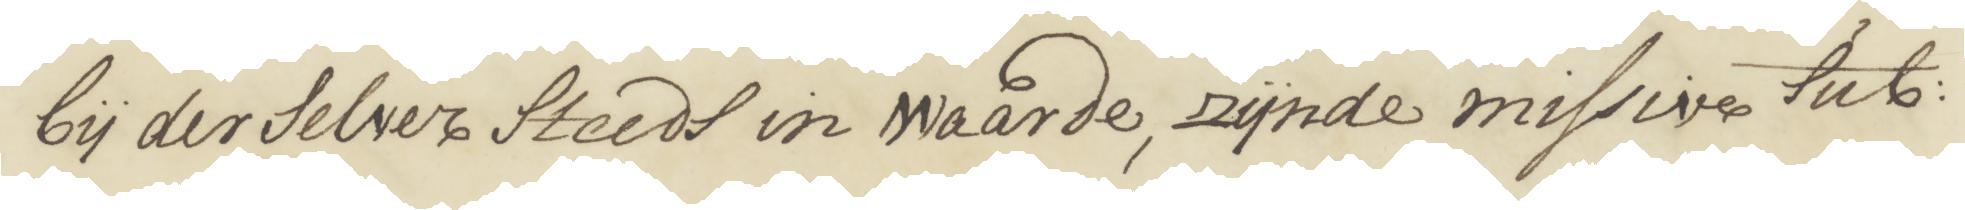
bij der selver steeds in waarde, zijnde missive sub:
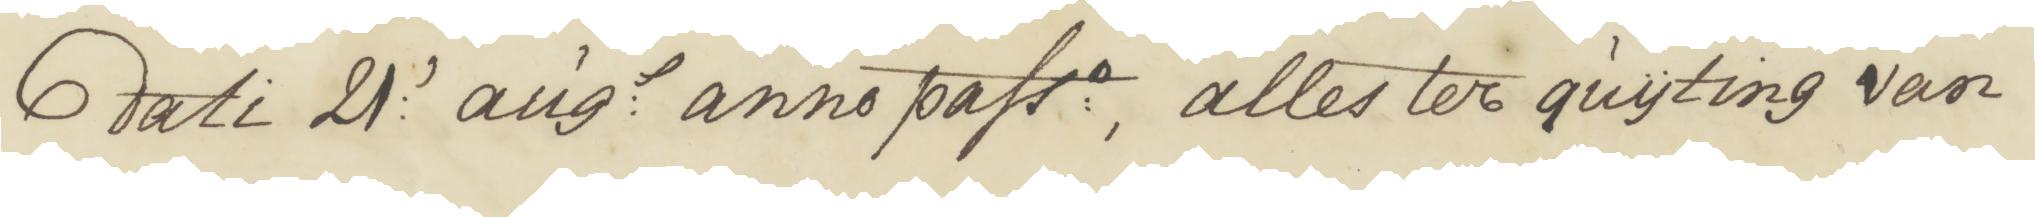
dati 21:' aug:s anno pass:o, alles ter quijting van
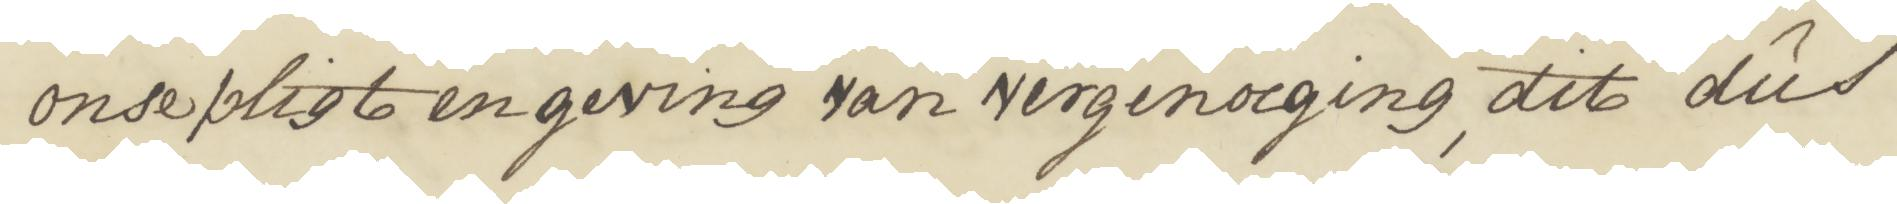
onse pligt en geving van vergenoeging, dit dus
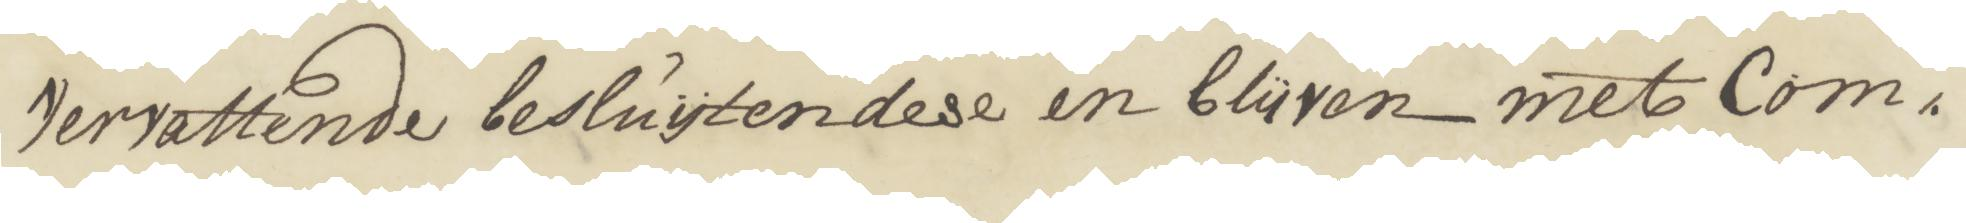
Vervattende besluijtendese en blijven met Com„
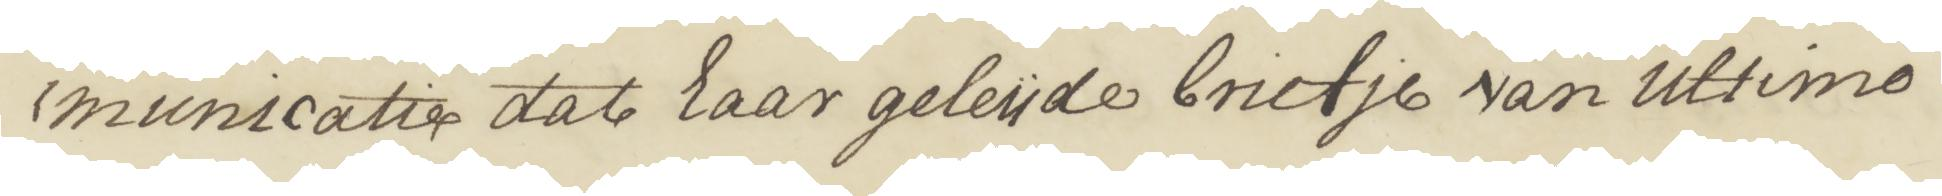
„municatie dat haar geleijde briefje van ultimo
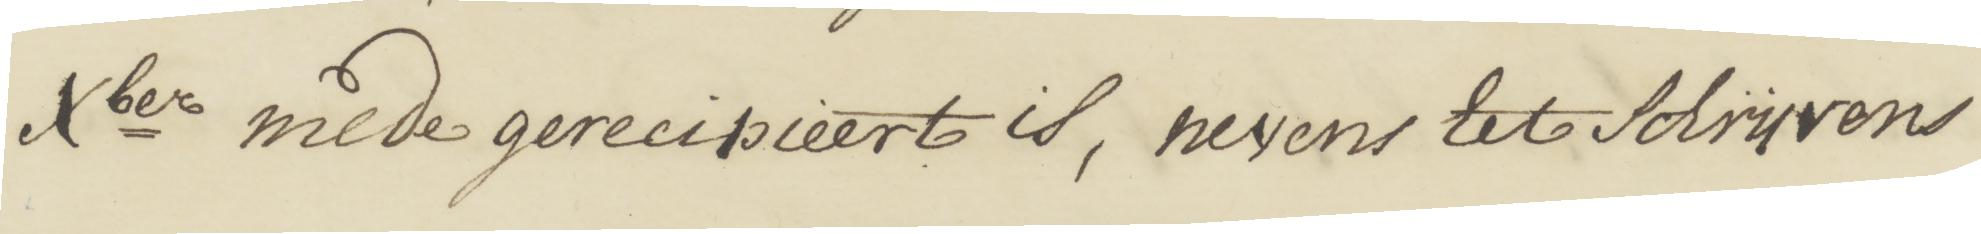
X=ber mede gerecipieert is, nevens het schrijvens
